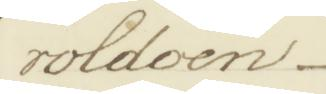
voldoen-
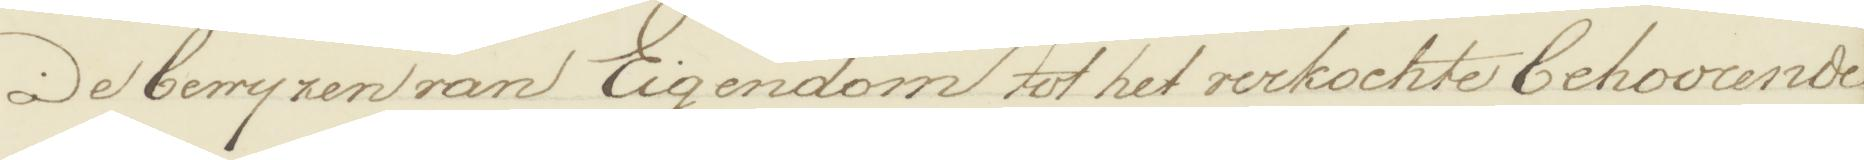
De bewyzen van Eigendom tot het verkochte behoorende
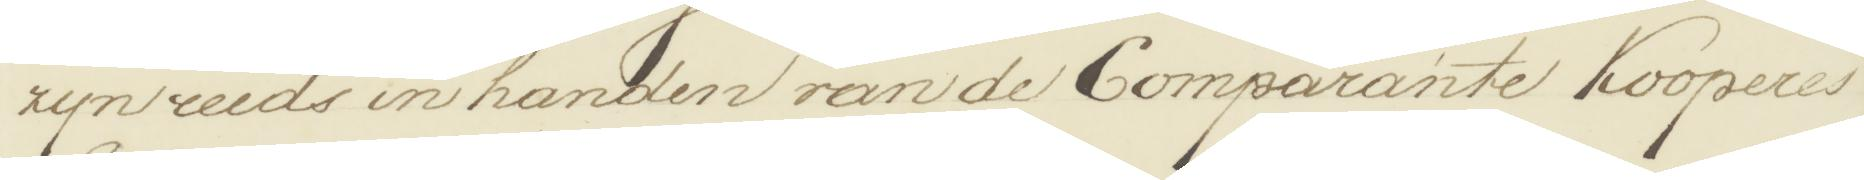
zyn reeds in handen van de Comparante Kooperes
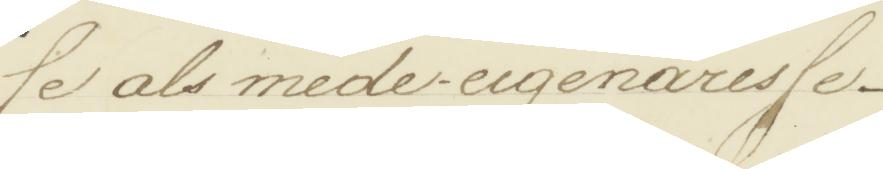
se als mede eigenaresse.-
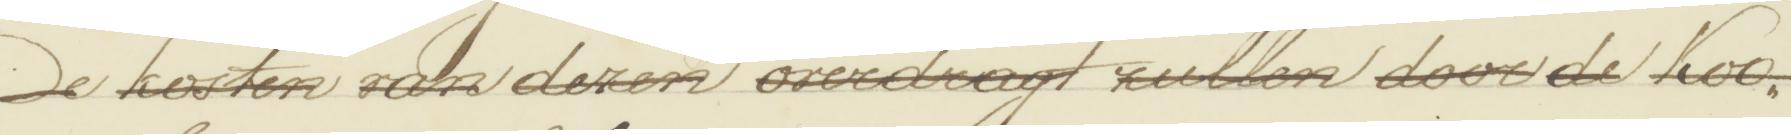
De kosten van dezen overdragt zullen door de koo„
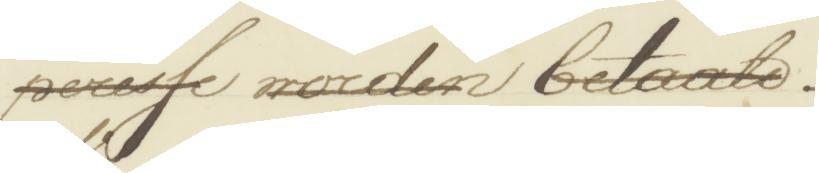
peresse worden betaald.
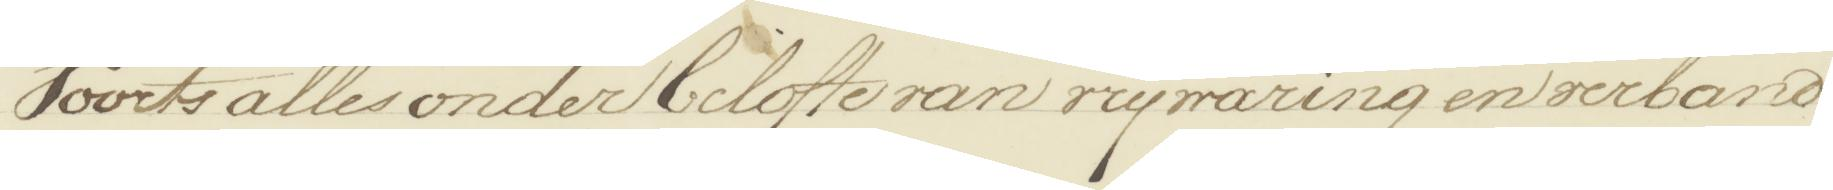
Voorts alles onder belofte van vrywaring en verband
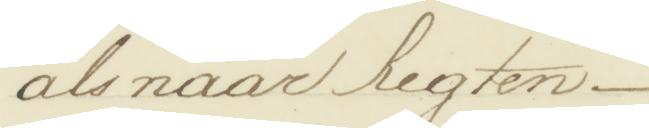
als naar Regten.—
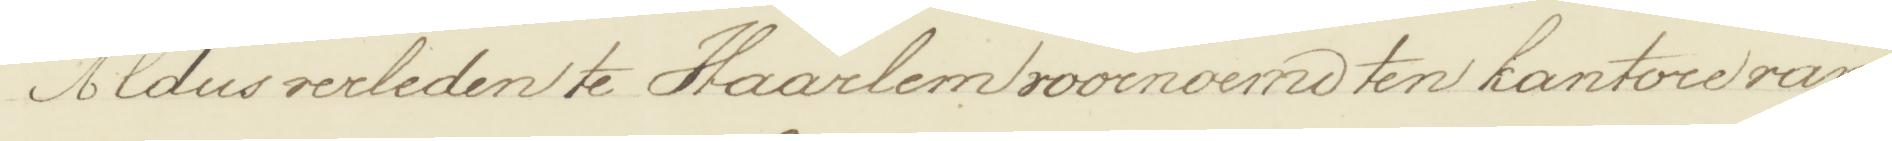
Aldus verleden te Haarlem voornoemd ten kantore van
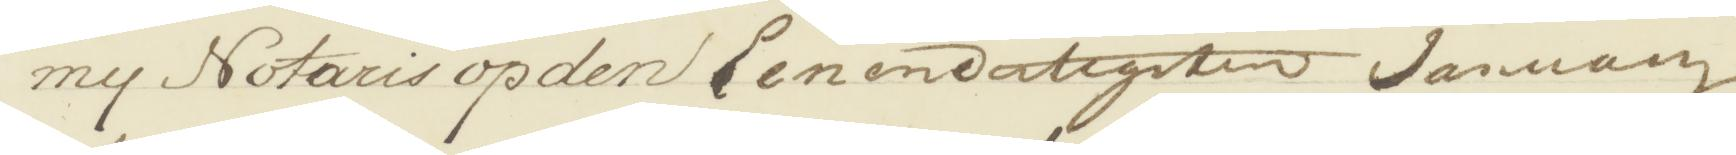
my Notaris op den Eenendertigsten Ianuary
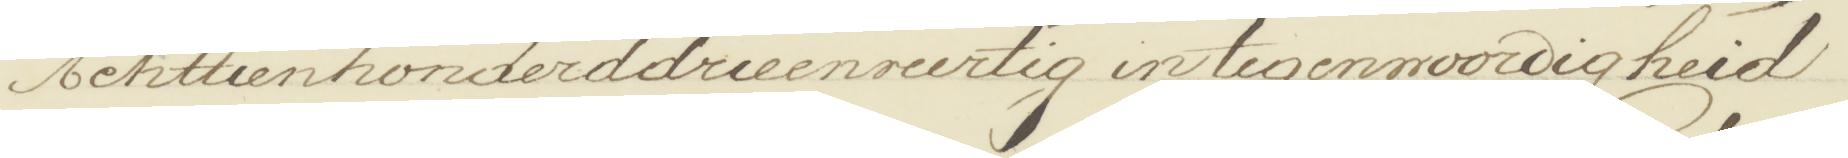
Achttienhonderd drieenveertig in tegenwoordigheid
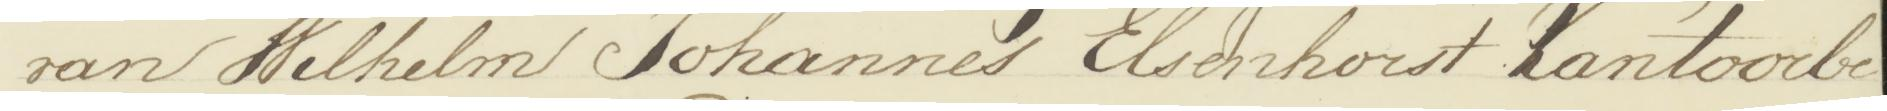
van Wilhelm Johannes Elsenhorst Kantoorbe=
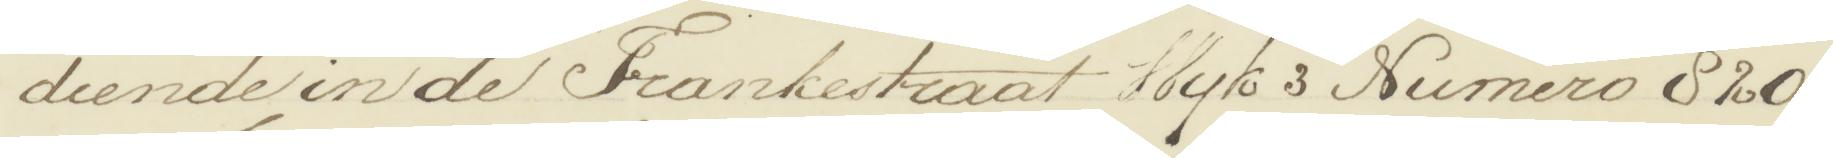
diende in de Frankestraat Wyk 3 Numero 820.
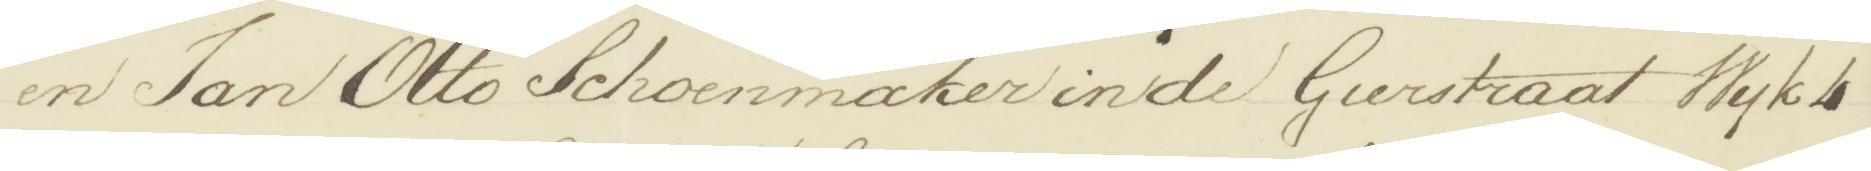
en Ian Otto Schoenmaker in de Gierstraat Wyk 4
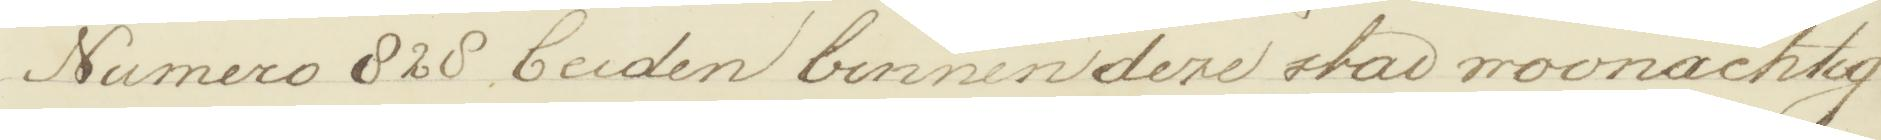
Numero 828. beiden binnen deze stad woonachtig
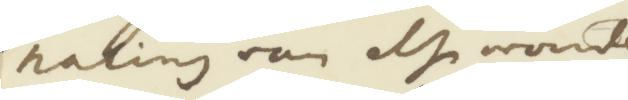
haling van elf woorden
